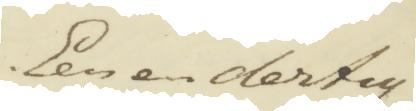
Een en dertig
